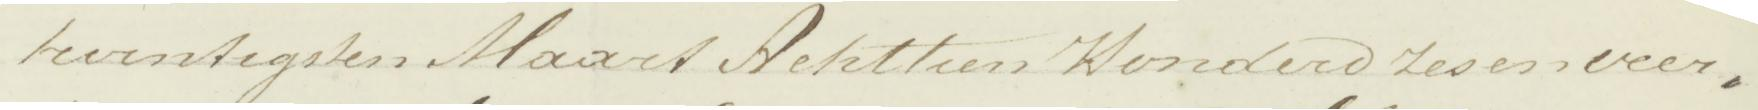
twintigsten Maart Achttien Honderd zes en veer„
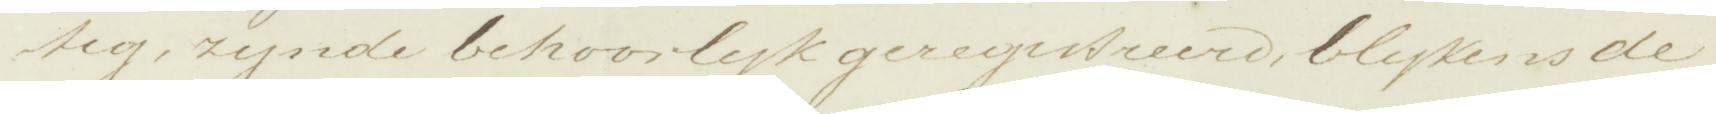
„tig, zynde behoorlyk geregistreerd, blykens de
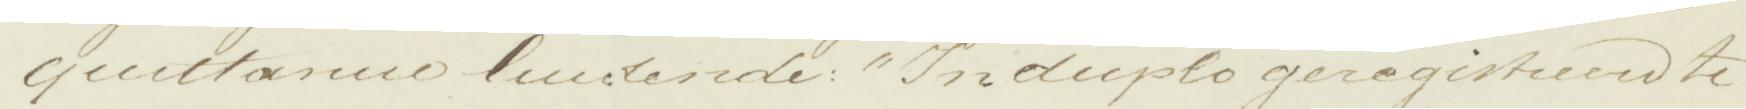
quittancie luidende: "In duplo geregistreerd te
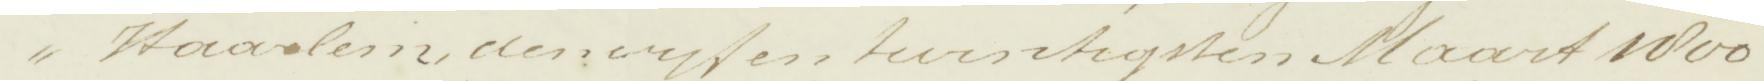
„ Haarlem, den vyf en twintigsten Maart 1800
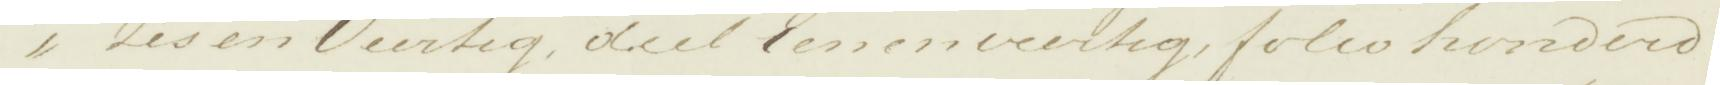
„ zes en Veertig, deel Een en veertig, folio honderd
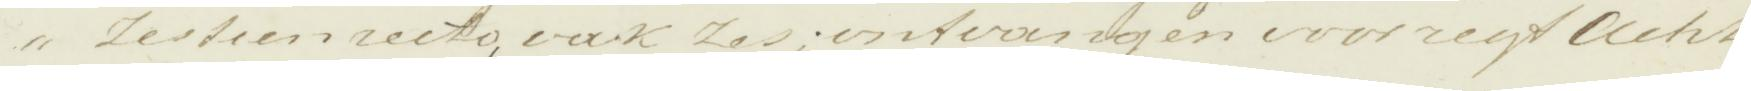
„ zestien recto, vak zes; ontvangen voor regt Acht
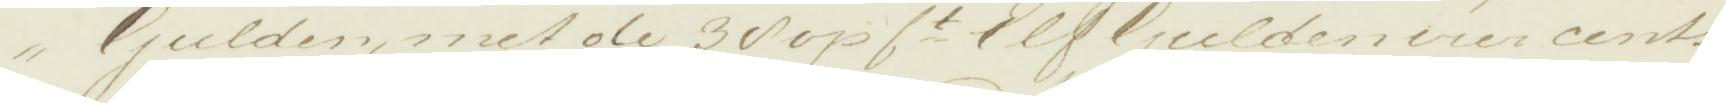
„ Gulden, met de 38 op C=t Elf Gulden vier cents
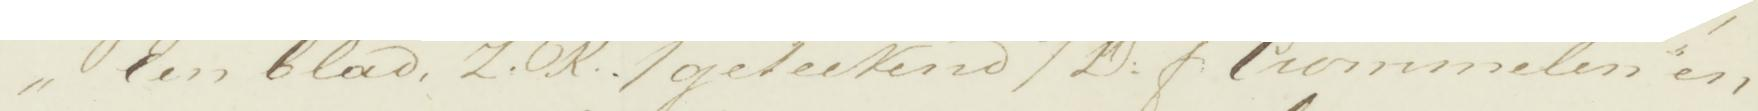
„ Een blad, Z.R.. / geteekend / D: f Crommelin en
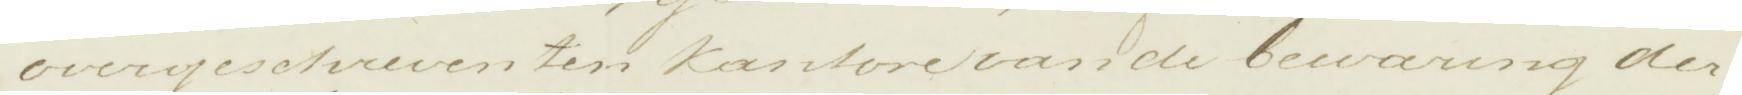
overgeschreven ten kantore van de bewaring der
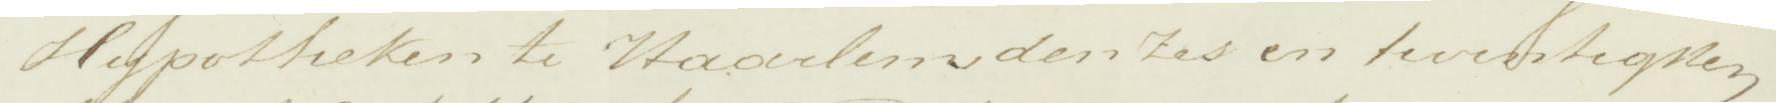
Hypotheken te Haarlem den zes en twintigsten
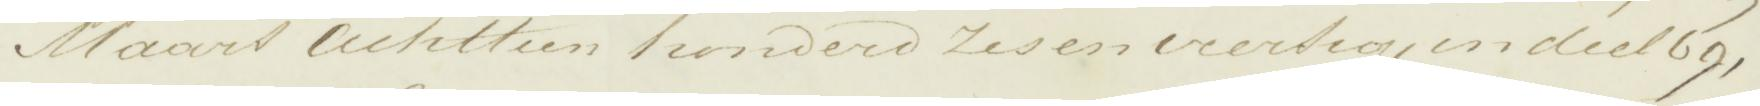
Maart achttien honderd zes en veertig, in deel 69,
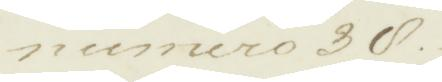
numero 38.
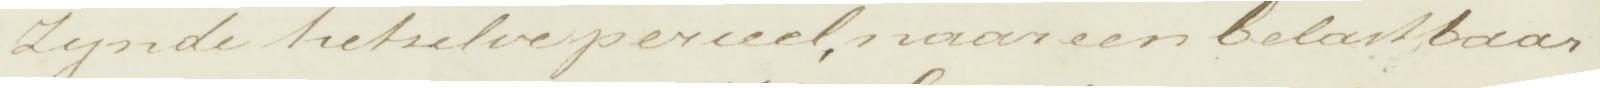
Zynde hetzelve perceel, naar een belastbaar
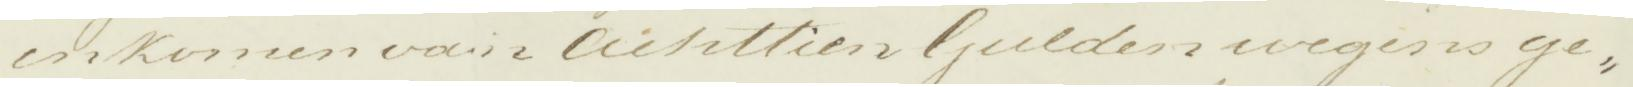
inkomen van Achttien Gulden wegens ge„
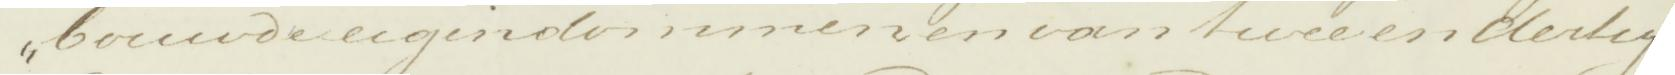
„bouwde eigendommen en van twee en dertig
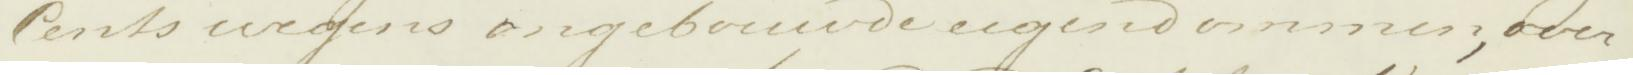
Cents wegens ongebouwde eigendommen, over
